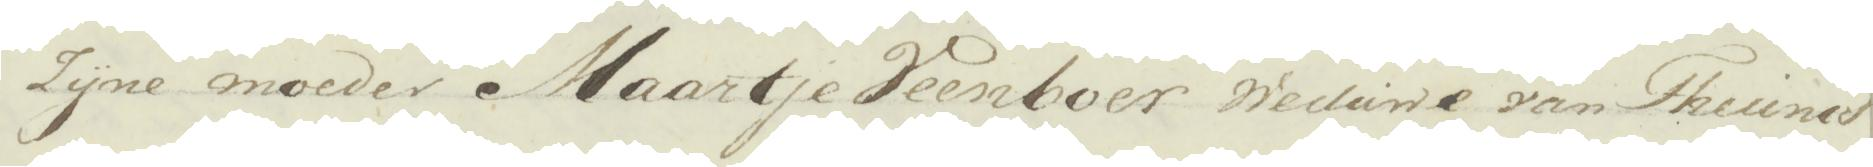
zijne moeder Maartje Veenboer weduwe van Theunis
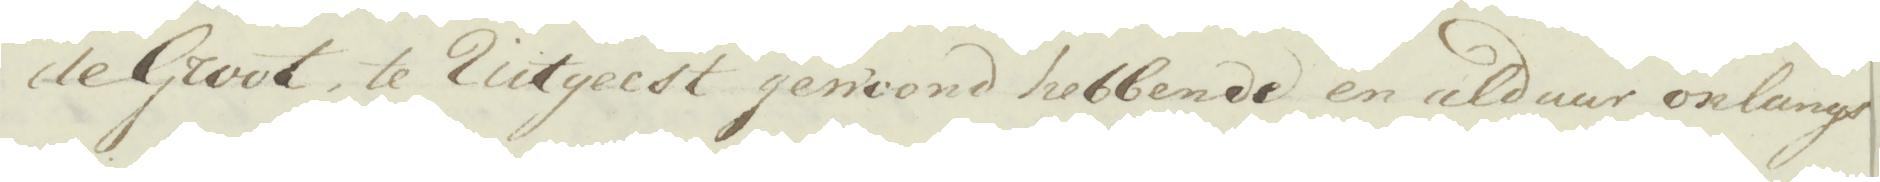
de Groot, te Uitgeest gewoond hebbende en aldaar onlangs
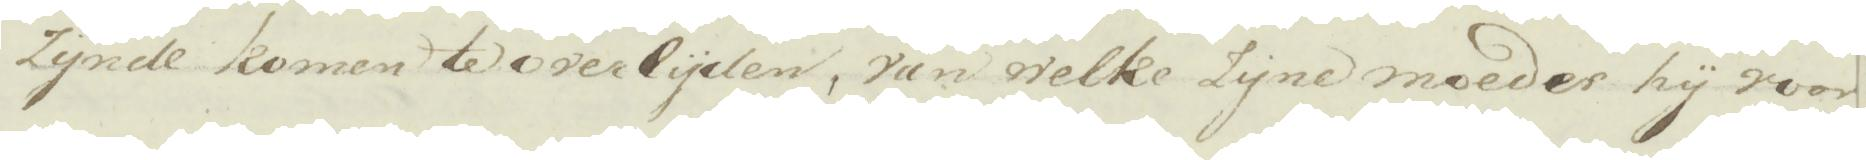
zijnde komen te overlijden, van welke zijne moeder hij voor
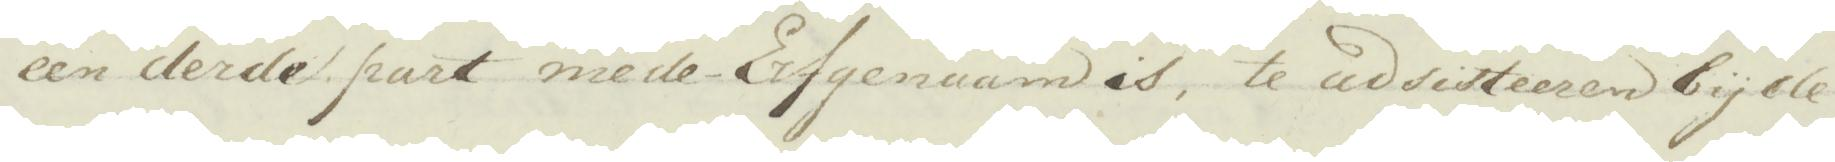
een derde part mede-Erfgenaam is, te adsisteeren bij de
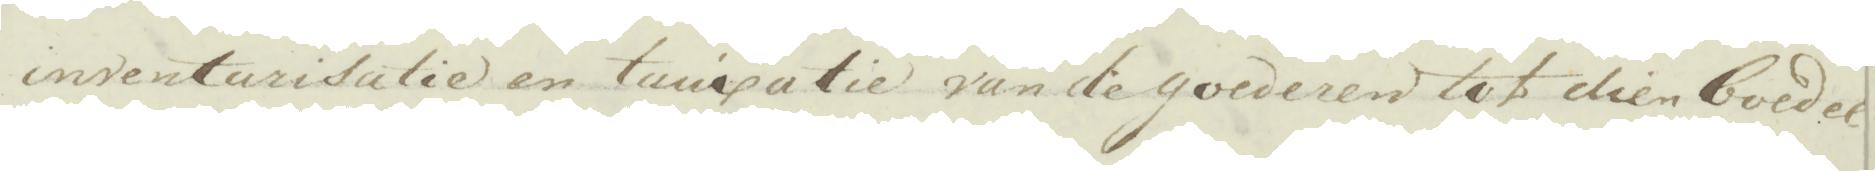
inventarisatie en tauxatie van de goederen tot dien boedel
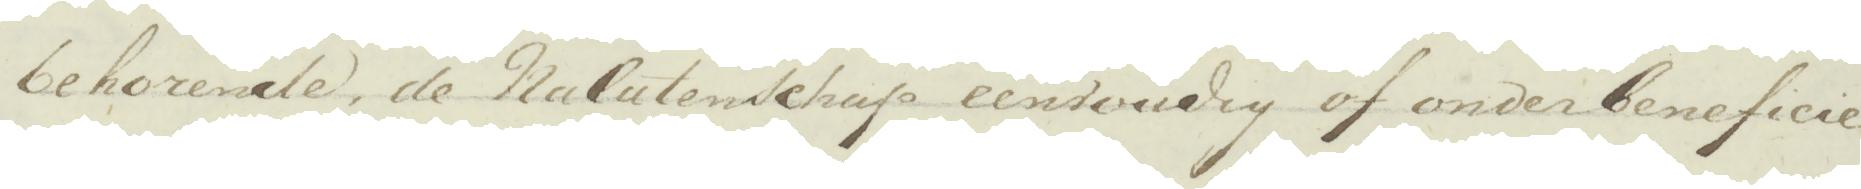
behorende, de Nalatenschap eenvoudig of onder beneficie
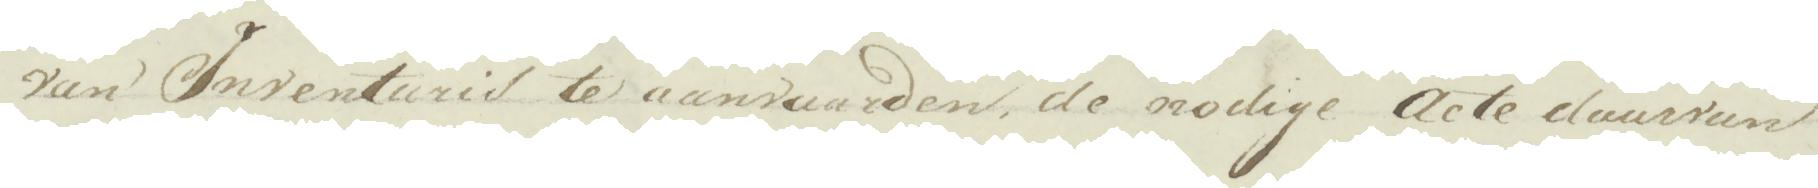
van Inventaris te aanvaarden, de nodige Acte daarvan
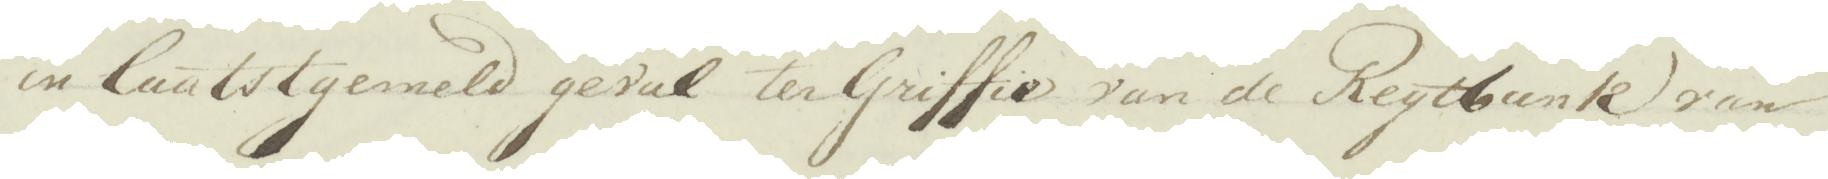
in laatstgemeld geval ter Griffie van de Regtbank van
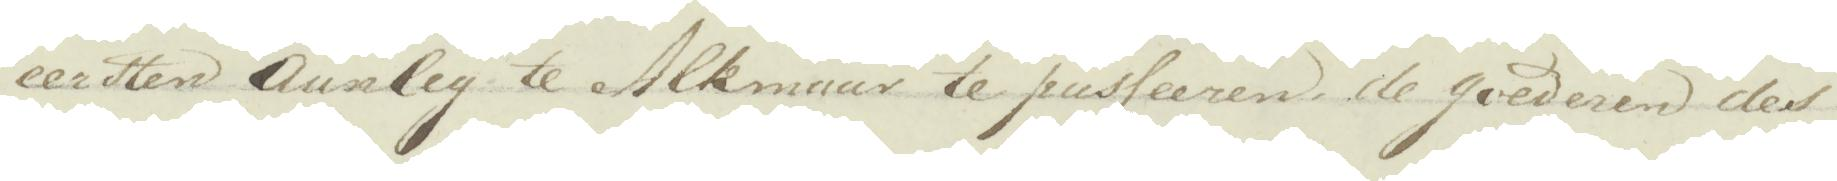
eersten Aanleg te Alkmaar te passeeren, de goederen des
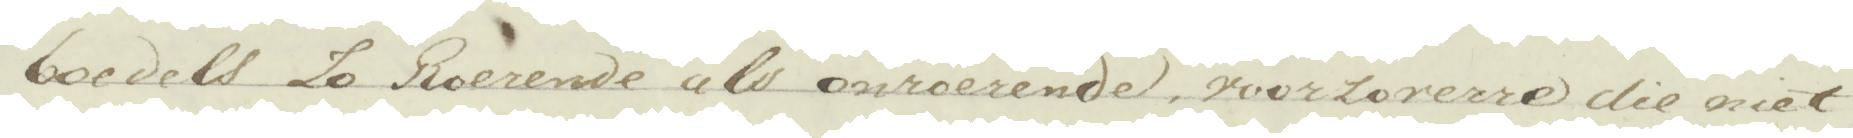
boedels zo Roerende als onroerende, voor zoverre die niet
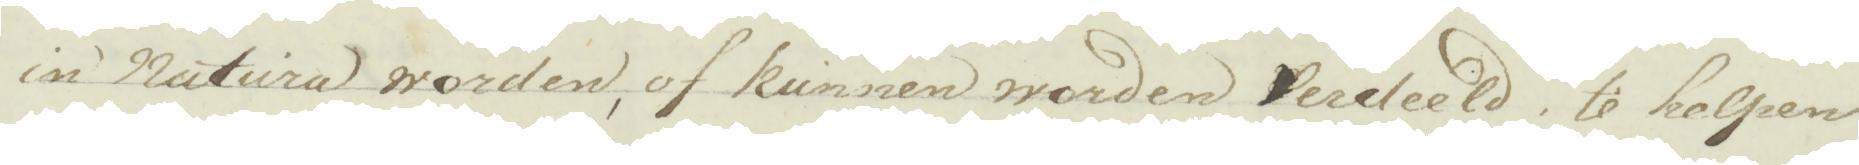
in natura worden, of kunnen worden verdeeld, te helpen
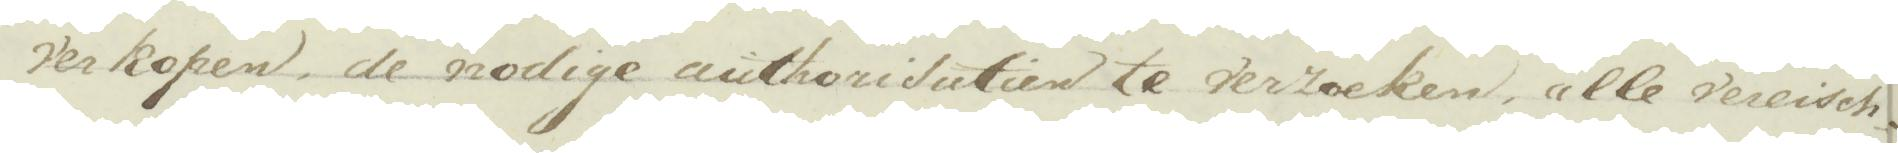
verkopen, de nodige authorisatien te verzoeken, alle vereisch
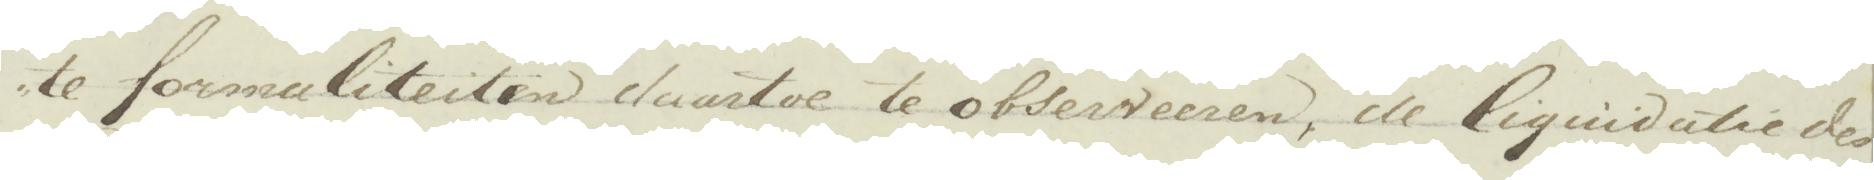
„te formaliteiten daartoe te observeeren, de liquidatie des
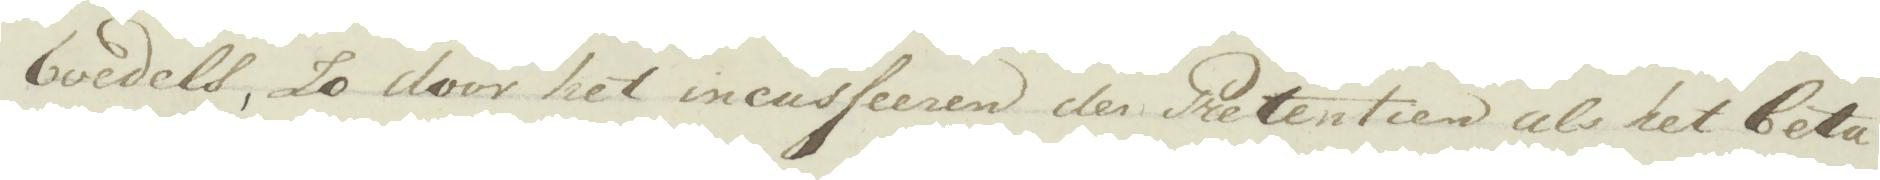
boedels, zo door het incasseeren der Pretentien als het beta
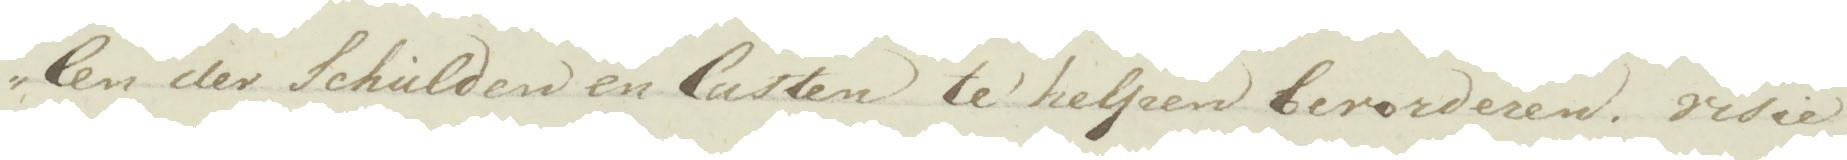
„len der schulden en lasten te helpen bevorderen. visie
